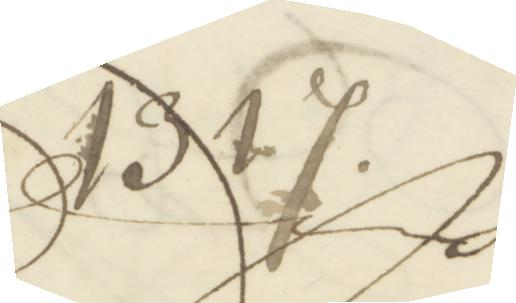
1317.
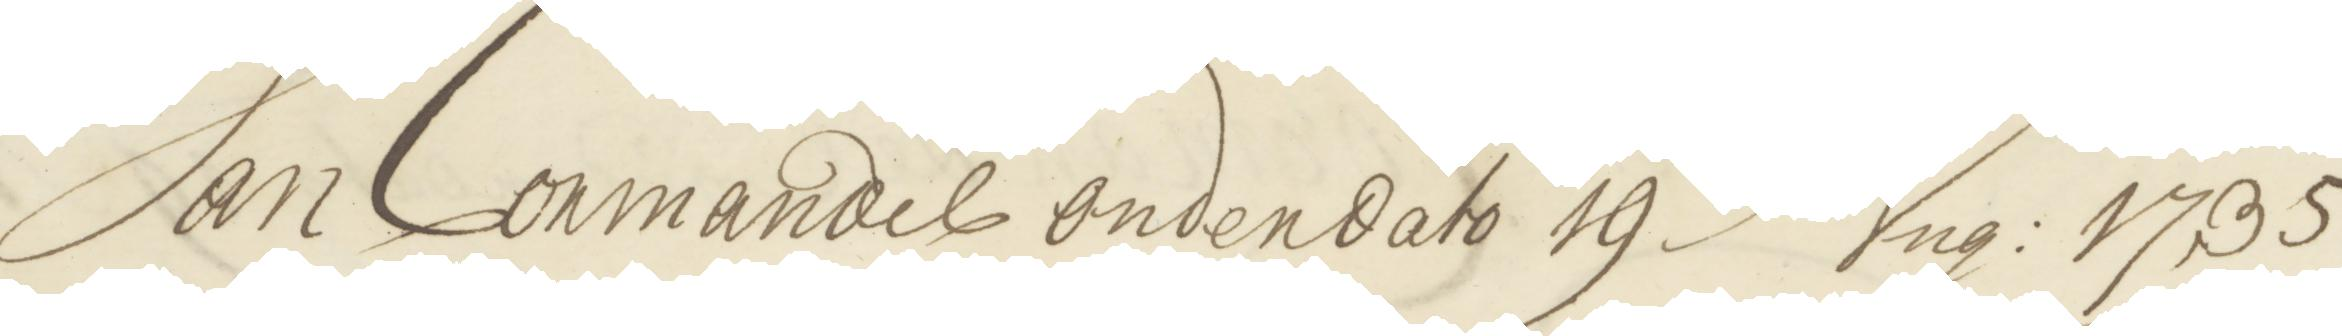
Van Cormandel onderdato 19 Aug: 1735
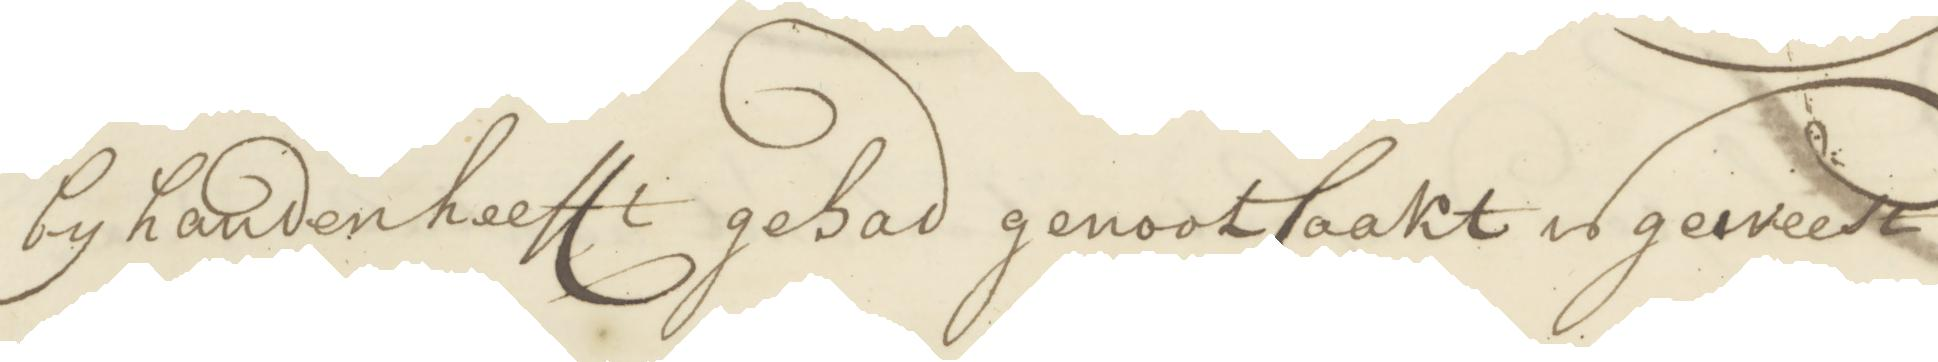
bij handenheefft gehad genootsaakt is geweest
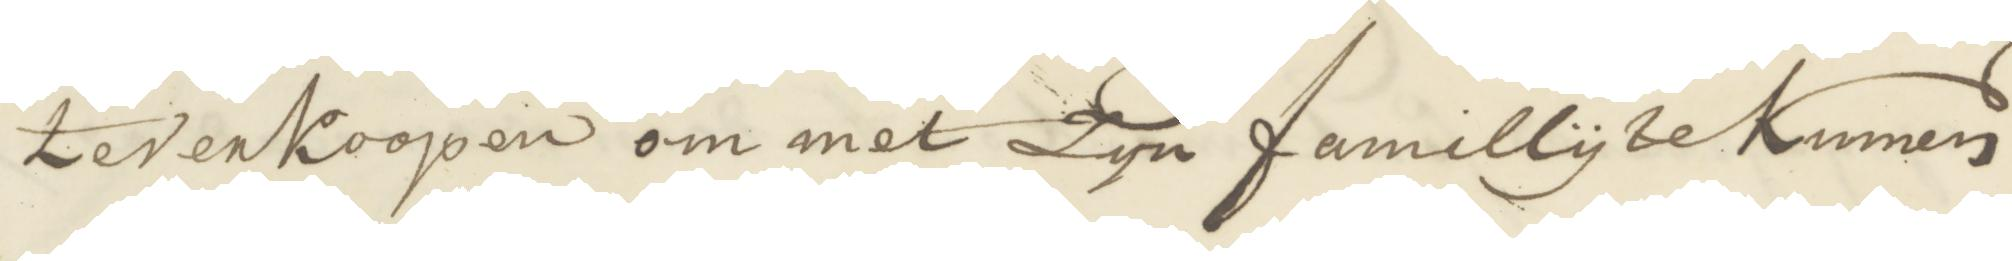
teverkoopen om met zyn famillij te kunnen
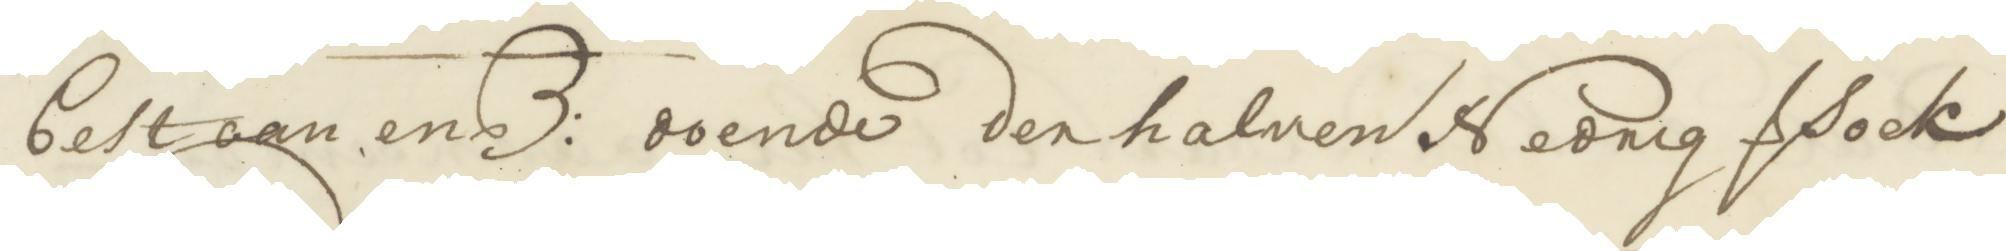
bestaan enz: doende derhalven Nedrig versoek
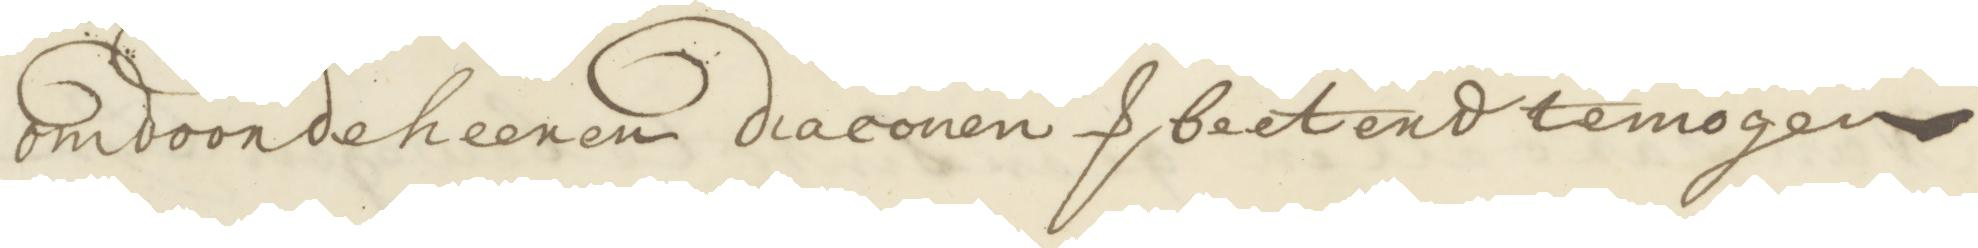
om door de heeren diaconen verbeeterd temogen
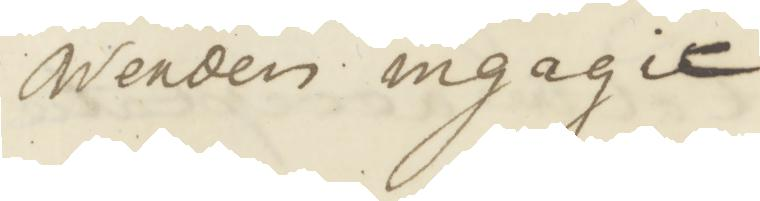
werden ingagic
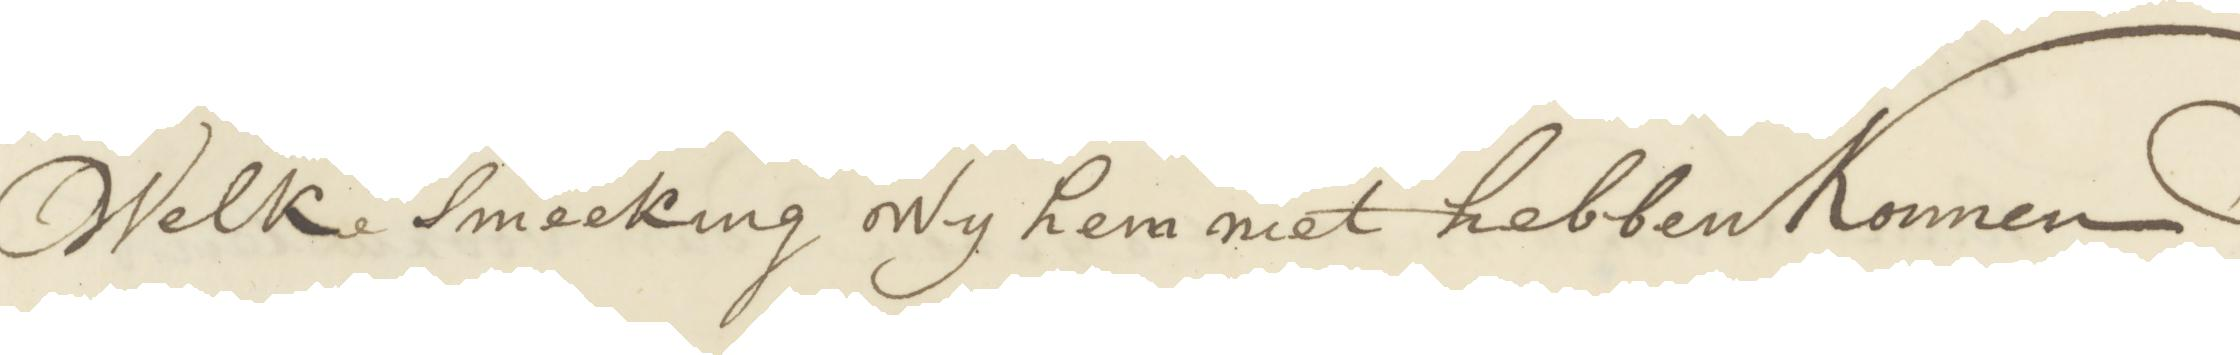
Welk smeeking wij hem niet hebben konnen
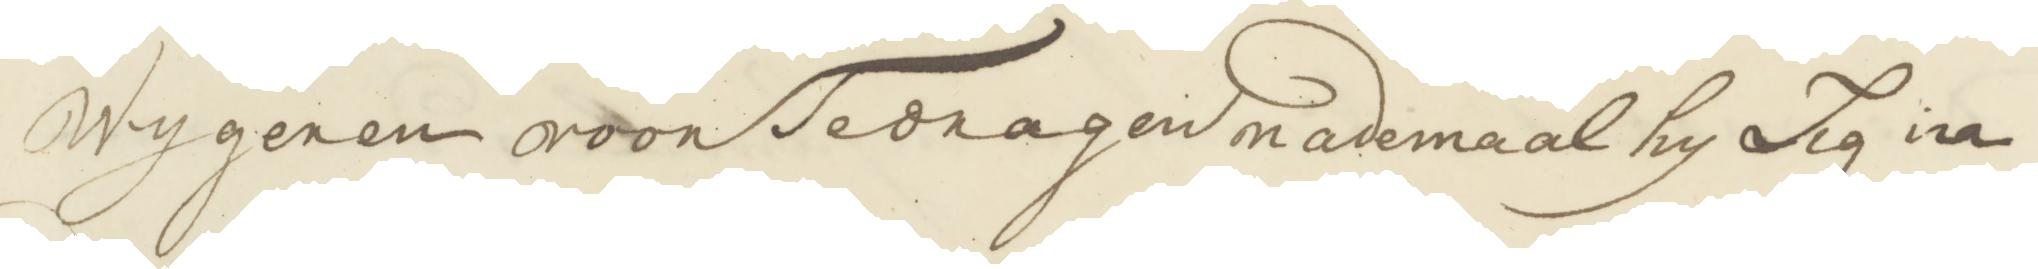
wijgeren voorTedragen nademaal hij sig in
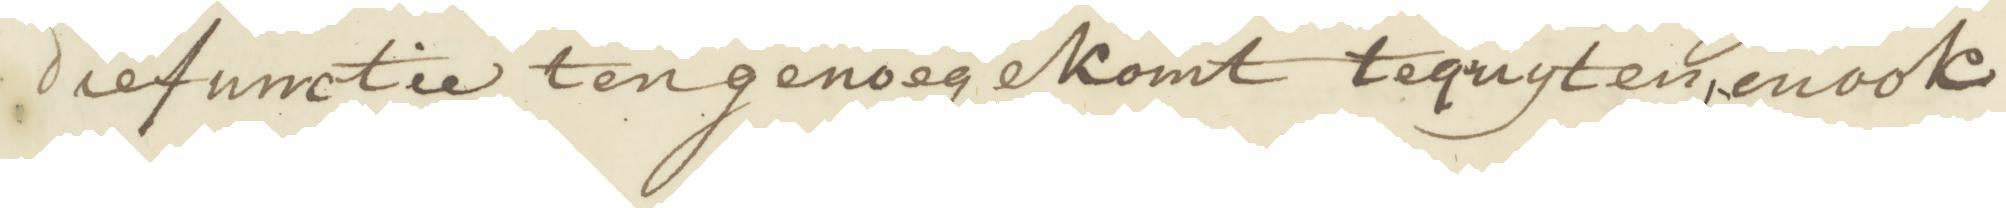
diefunctie ten genoegekomt tequyten, enook
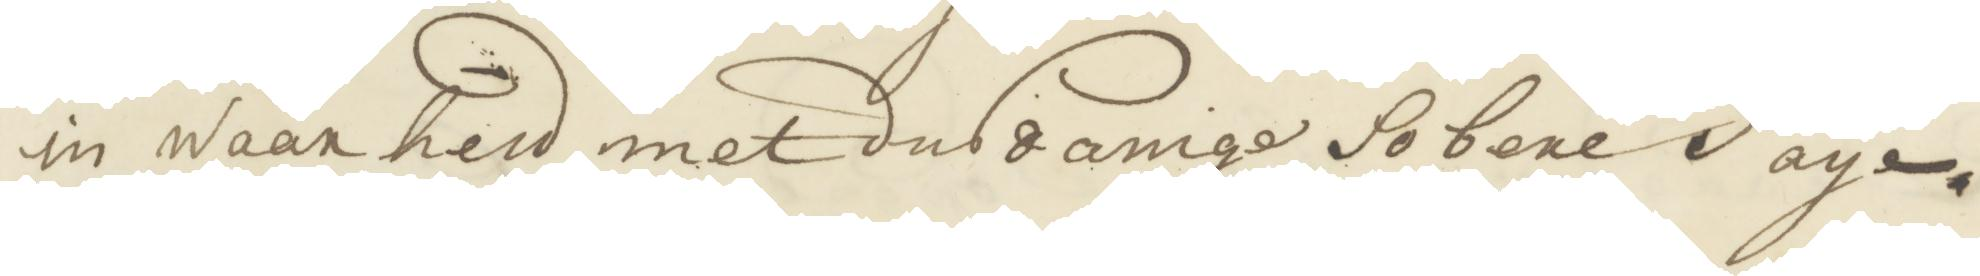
in waar heid met dus danige sobere Paye,
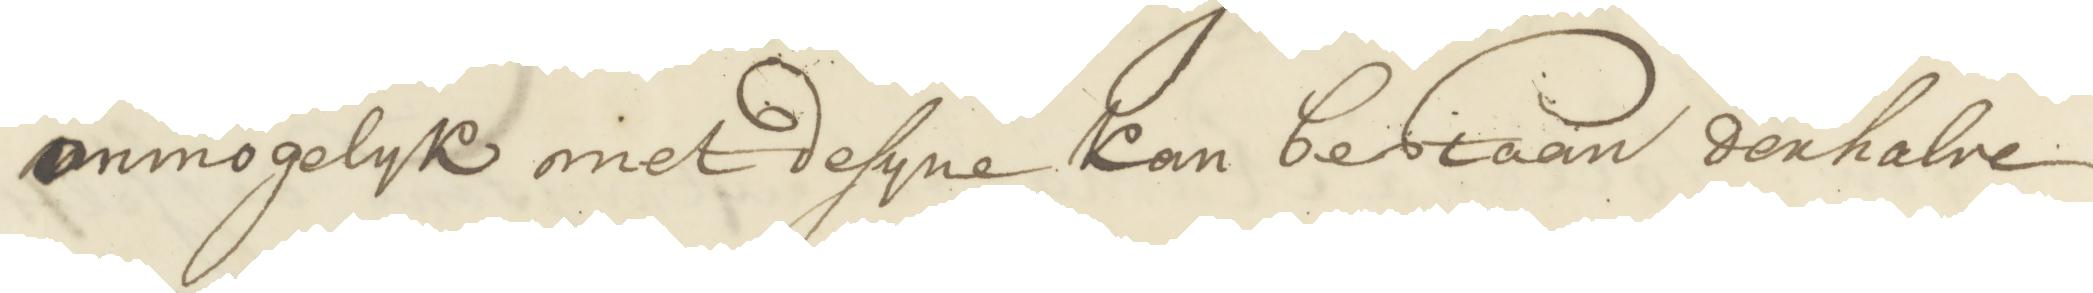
onmogelyk niet desyne kan bestaan derhalve
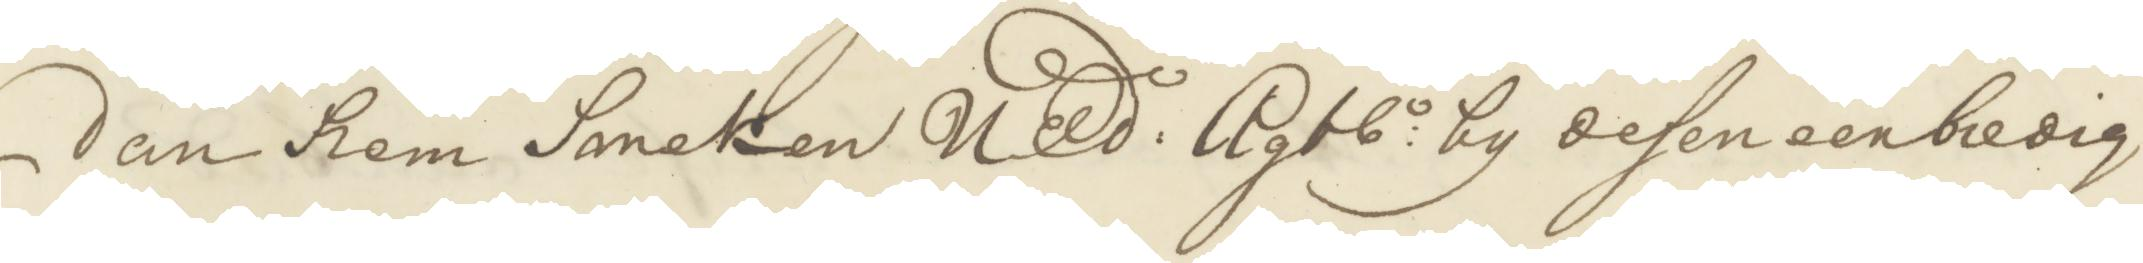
dan hem smeken UEd: Agtb:e bij desen eerbiedig
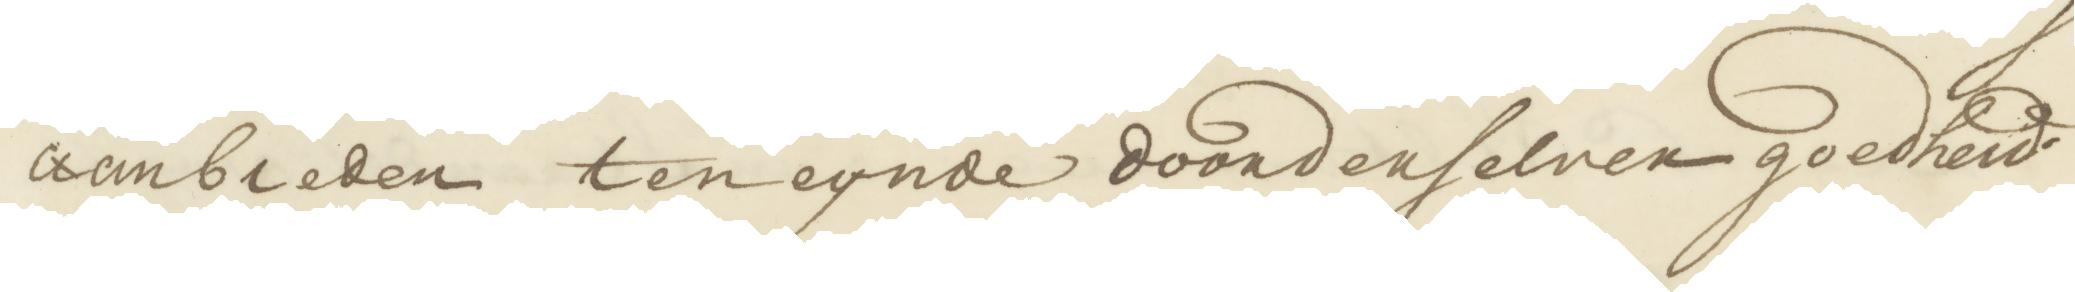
aanbieden ten eynde doorderselver goedheid
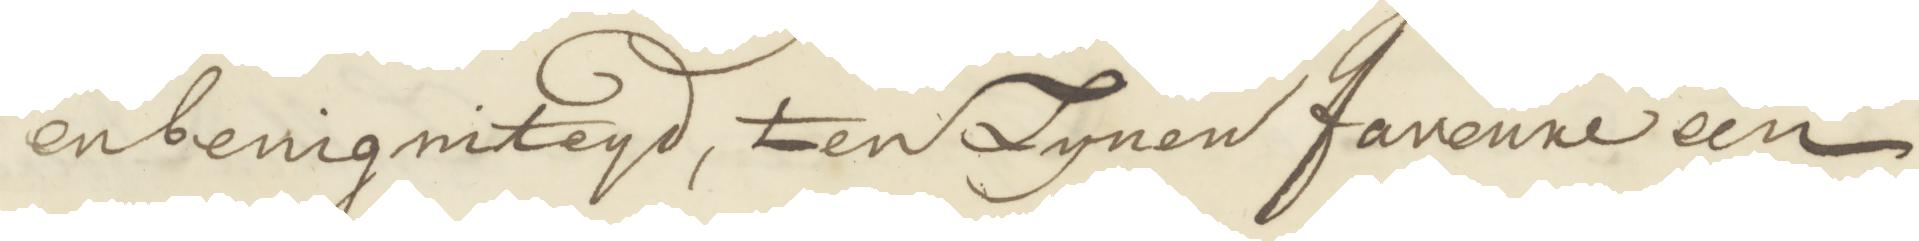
enbenigniteijd, ten zijnen faveure een
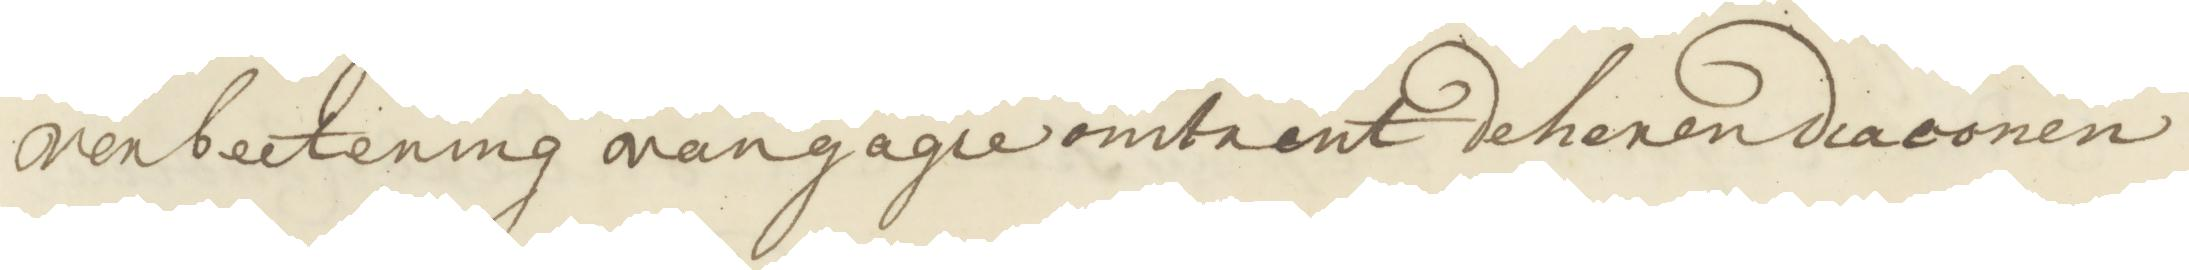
verbeetering vangagie omtrent deherendiaconen
